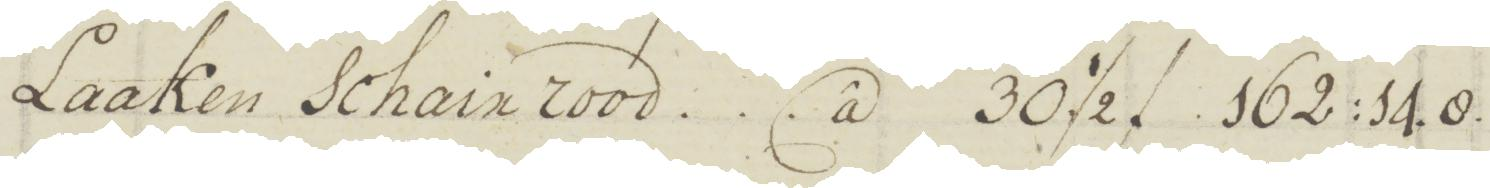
Laaken schair rood . . . @ 30½ ƒ . 162:14. 8.
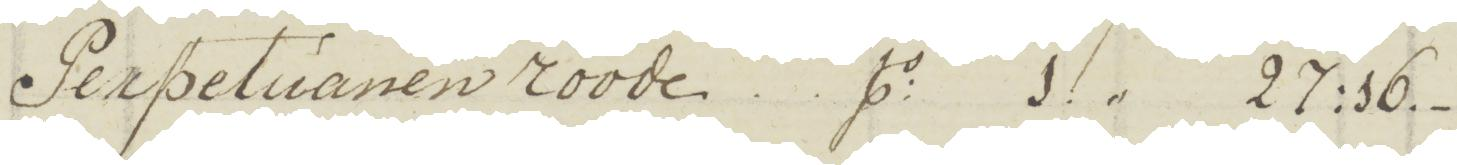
Perpetuanen roode . . p:s 1. „ 27:16.–
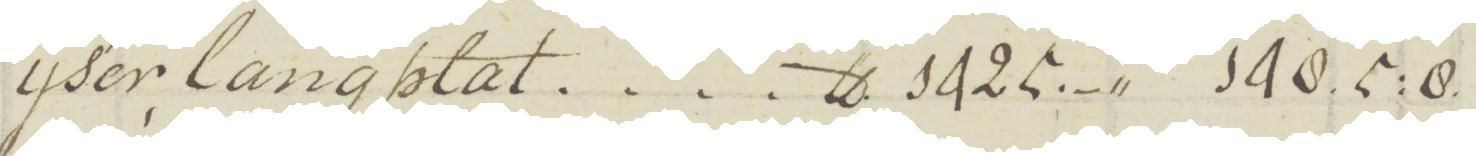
ijser lang plat . . . . lb. 1425. – „ 148. 5: 8.
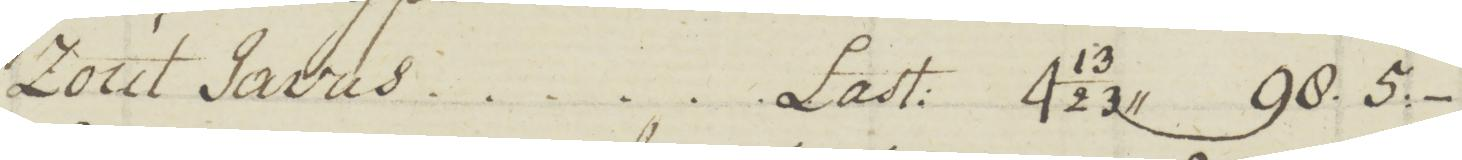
zout Iavas . . - . . . Last: 4 13/23 „ 98. 5: –
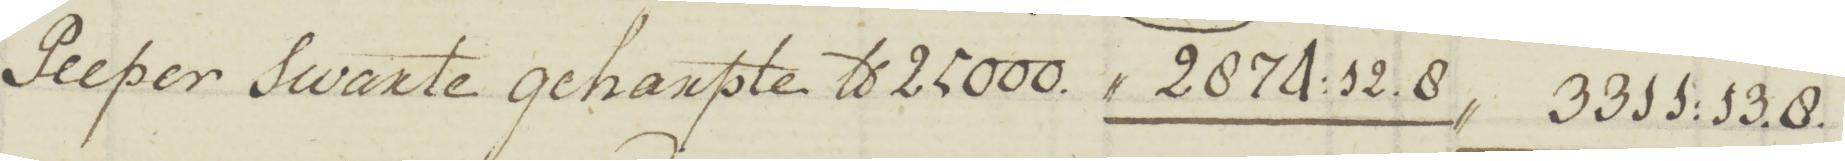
Peeper swarte geharpte lb 25000. „ 2874:12.8 „ 3311:13.8.
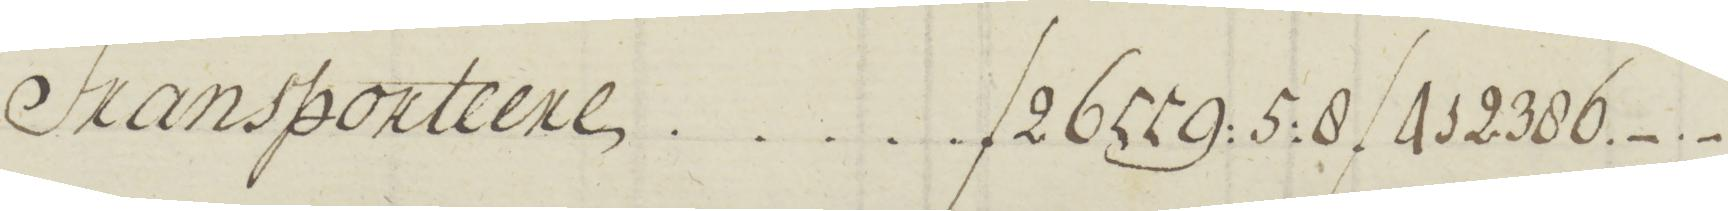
Transporteere . . . . . ƒ26559:5:8 ƒ412386. – . –
